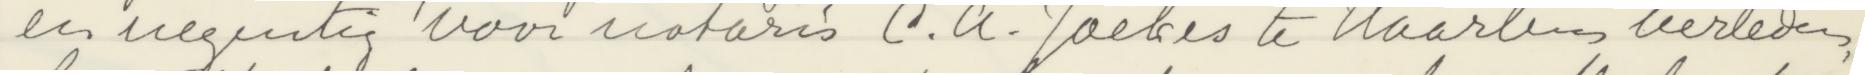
en negentig voor notaris C.A. Joekes te Haarlem verleden,
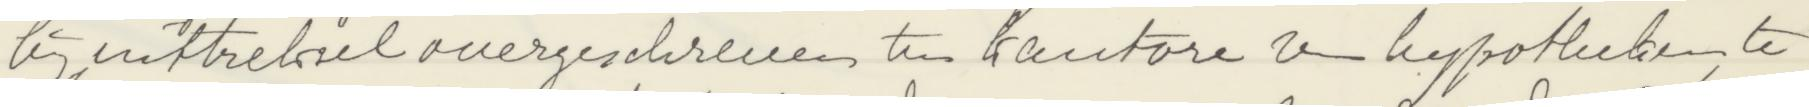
bij uittreksel overgeschrevven ten kantore van hypotheeken te
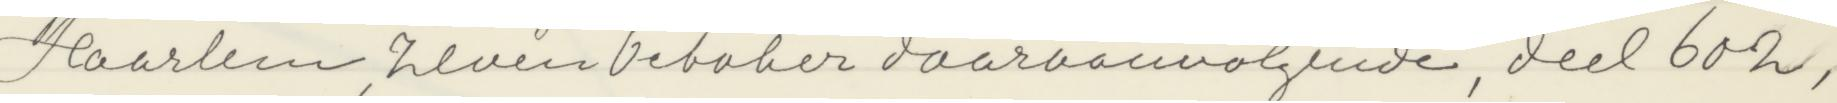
Haarlem zeven October daaraanvolgende, deel 602,
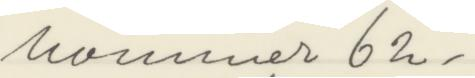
nommer 62.
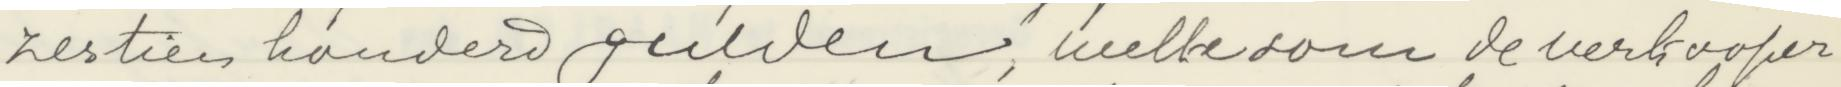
zestien honderd gulden; welke som de verkooper
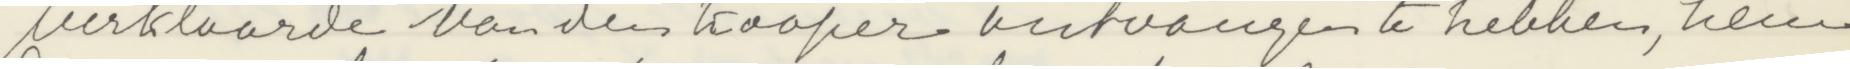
verklaarde van den kooper ontvangen te hebben, hem
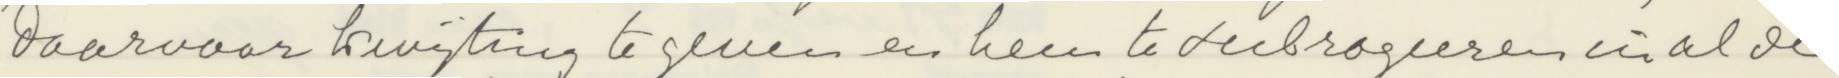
daarvoor kwijting te geven en hem te subrogeeren in al de
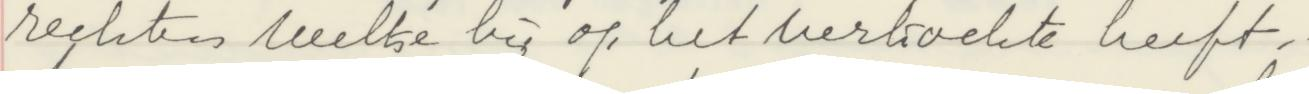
rechten welke hij op het verkochte heeft.
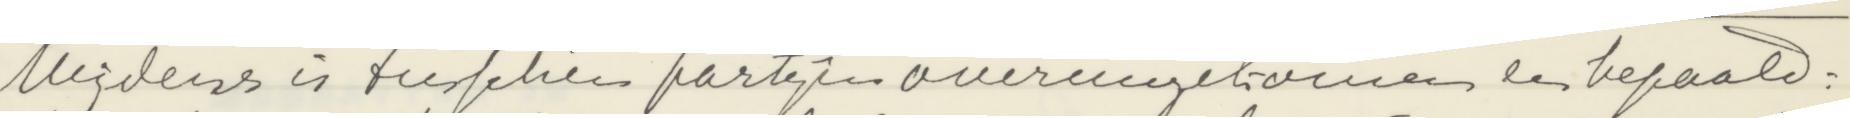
Wijders is tusschen partjen overeengekomen en bepaald:
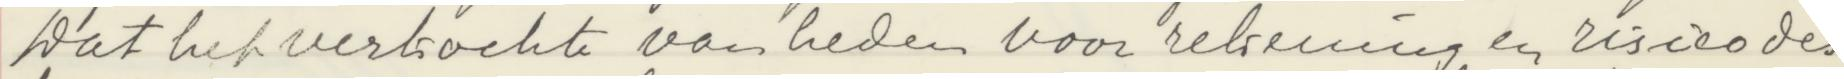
dat het verkochte van heden voor rekening en risico des
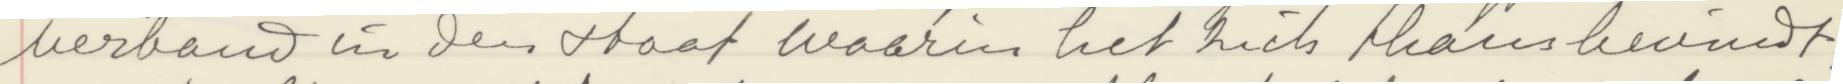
verband in den staat waarin het zich thans bevindt,
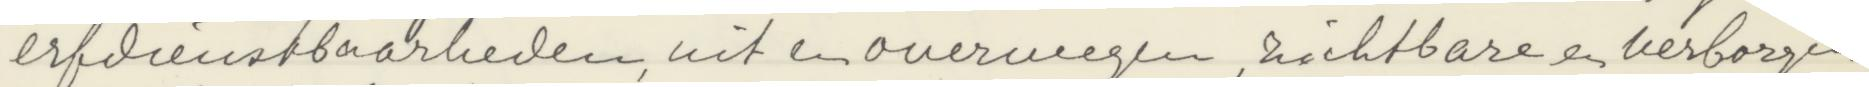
erfdienstbaarheden, uit en overwegen, zichtbare en verborgen
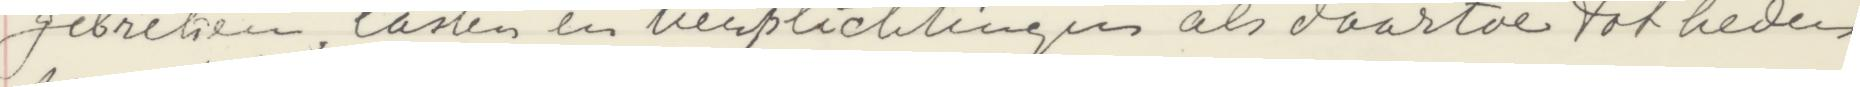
gebreken, lasten en verplichtingen als daartoe tot heden
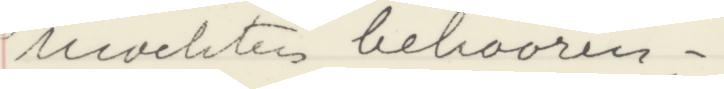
mochten behooren -
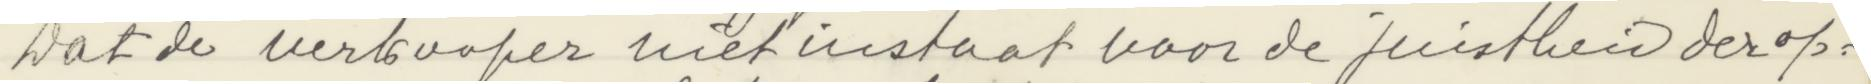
Dal de verkooper niet instaat voor de juistheid der op=
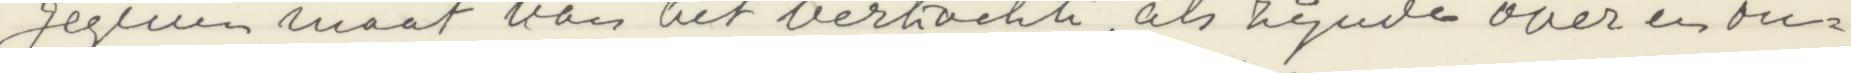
gegeven maat van het verkochte, als zijnde over en on=
